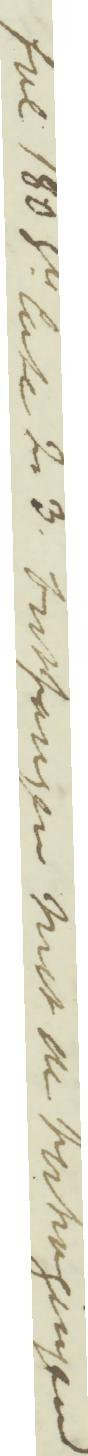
fol. 18- V.r late 2. 3 ontfangen met de verhogingen
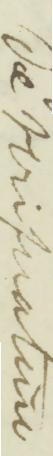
de cerificatien
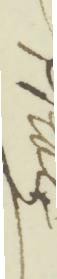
Haeg
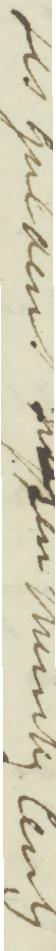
Zes gulden zesen twintig cents
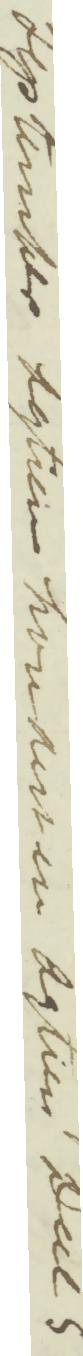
September agtien honderten agtien Deel 5
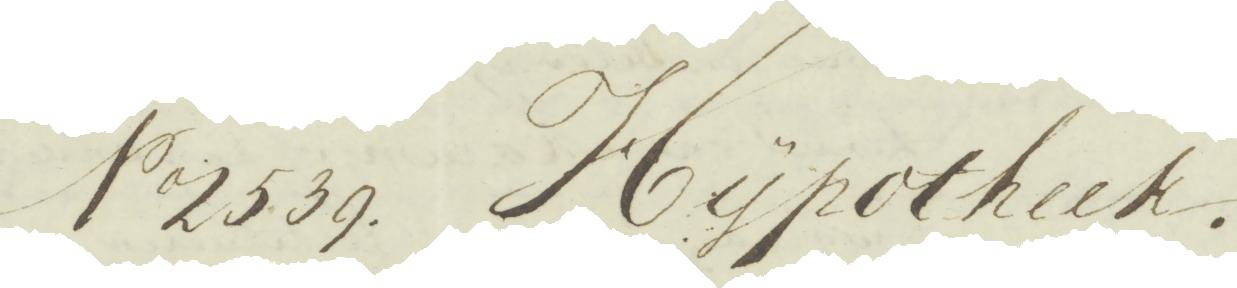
N:o 2539. Hijpotheek.
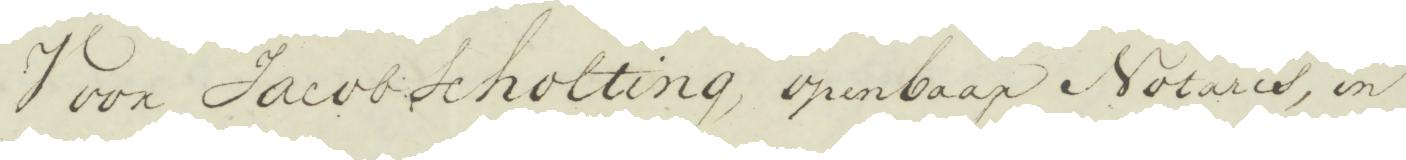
Voor Jacob Scholting, openbaar Notaris, in
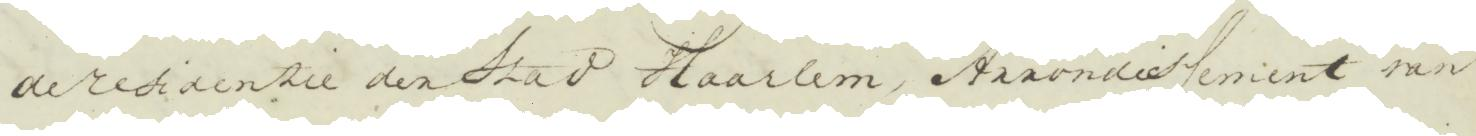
de residentie der stad Haarlem, Arrondissement van
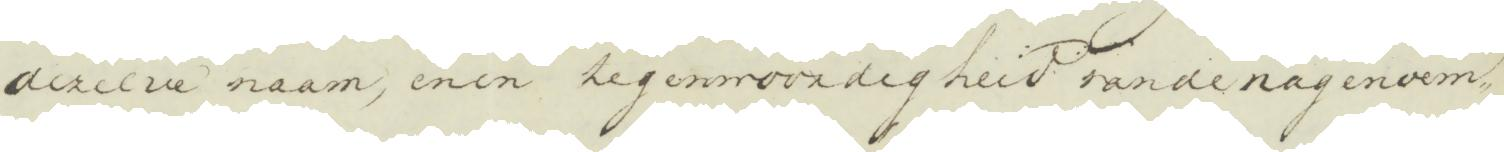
dezelve naam, en in tegenwoordigheid van de nagenoem„
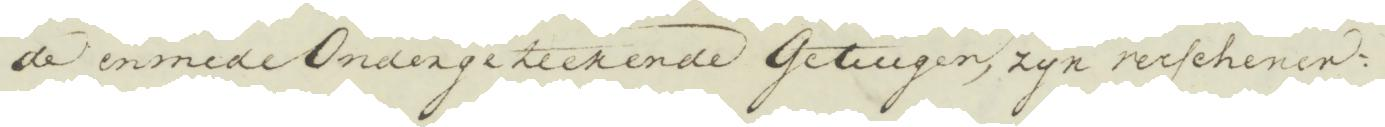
de en mede Ondergeteekende Getuigen, zijn verschenen:
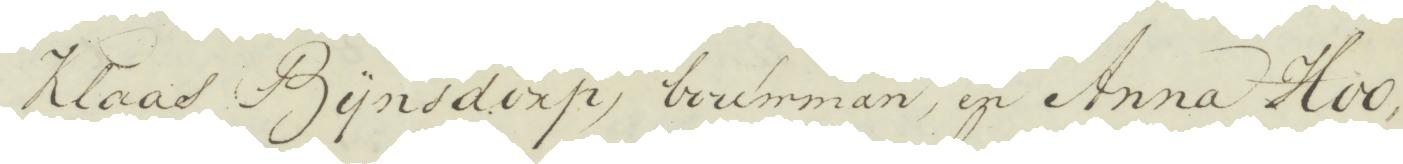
Klaas Bijnsdorp, bouwman, en Anna Hoo,
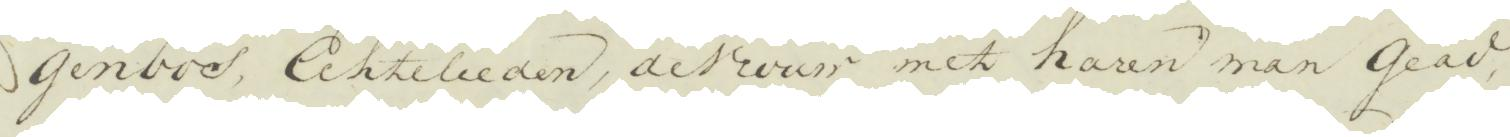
genbos, Echtelieden, de Vrouw met haren man gead,
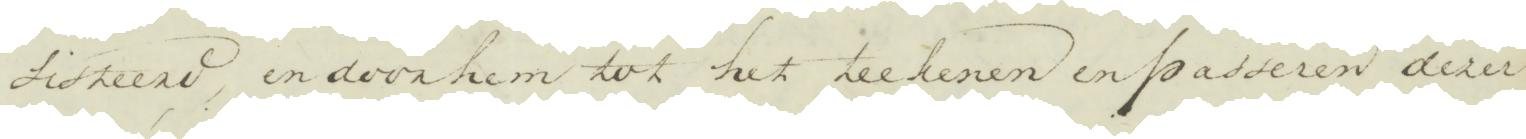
sisteerd, en door hem tot het teekenen en passeren dezer
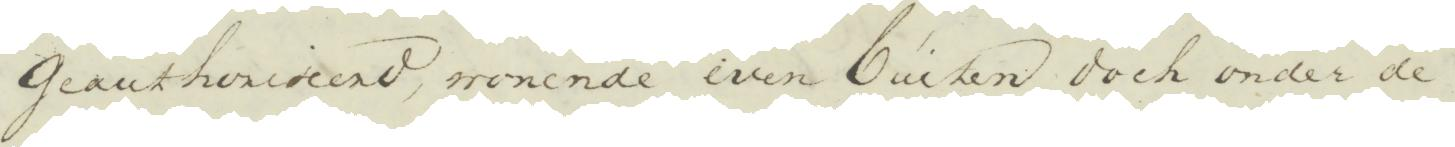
Geauthoriseerd, wonende even buiten doch onder de
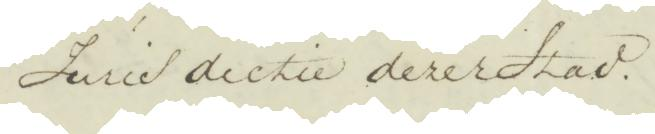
Iuris dictie dezer stad.
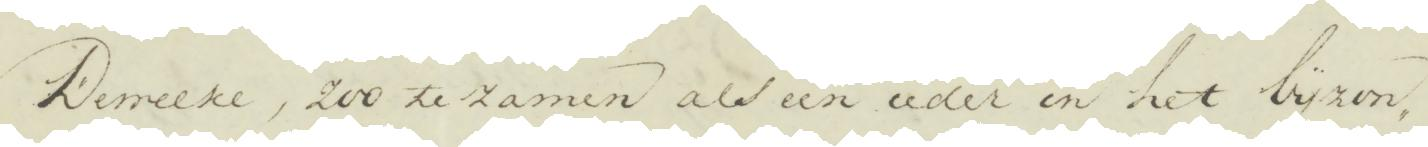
Dewelke, zoo te zamen als een ieder in het bijzon„
